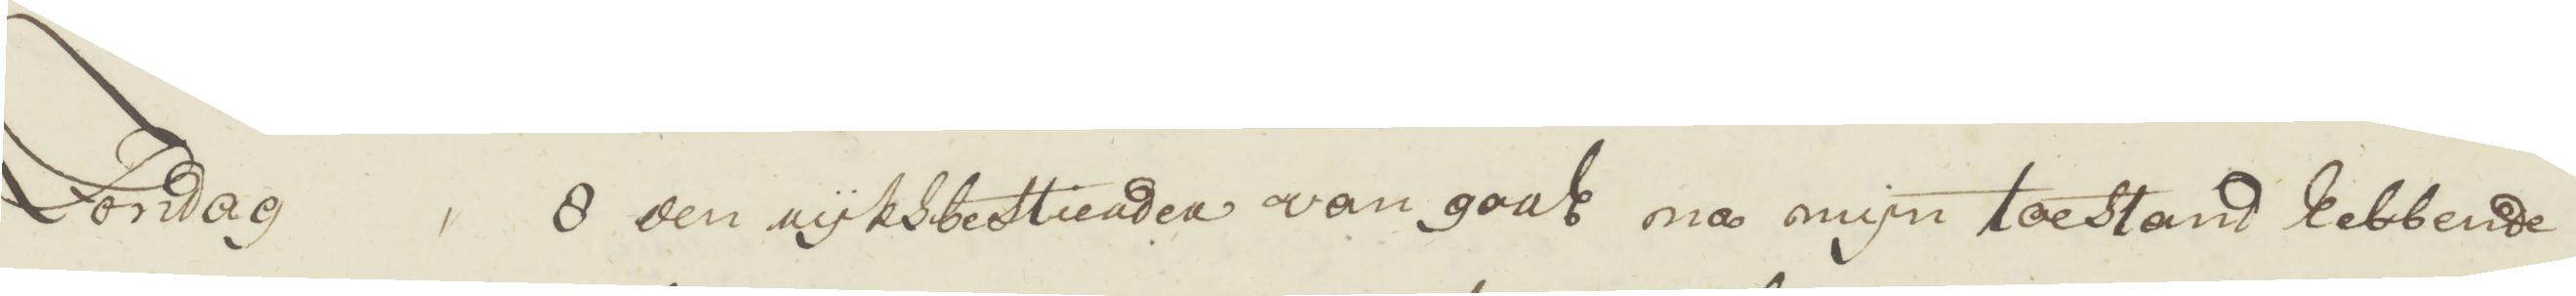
Zondag, 8 den rijksbestierder van goah na mijn toestand hebbende
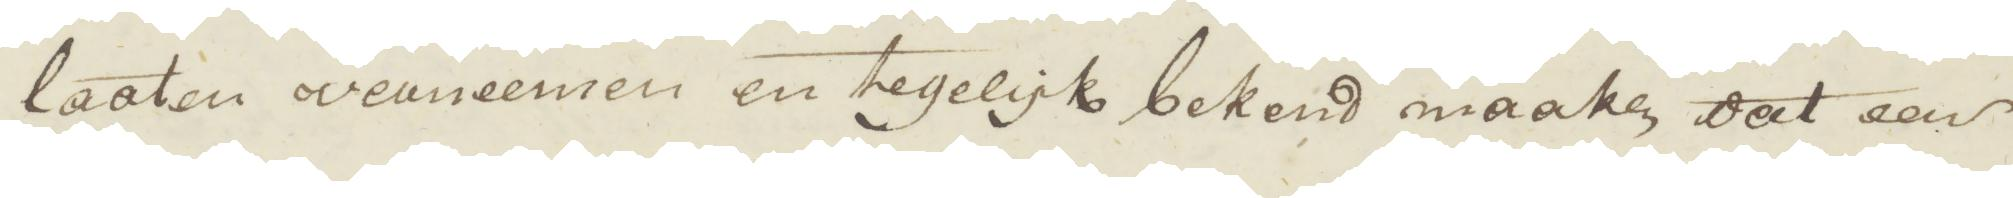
laaten verneemen en tegelijk bekend maaken dat een
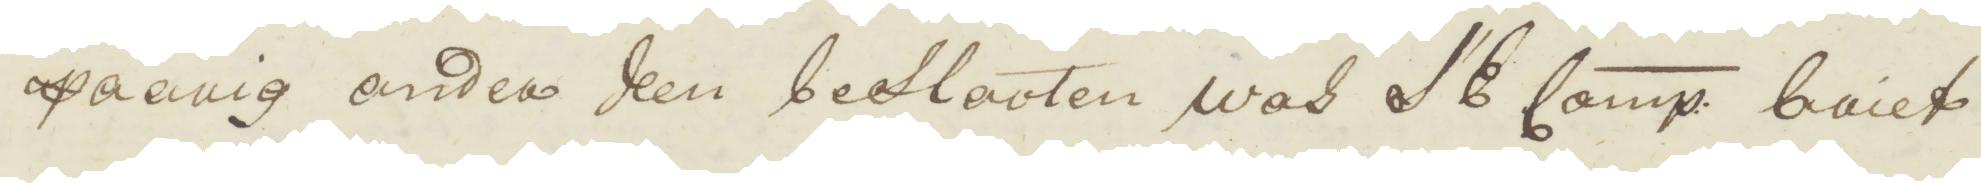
paarig onder hen beslooten was s'E Comp: brief
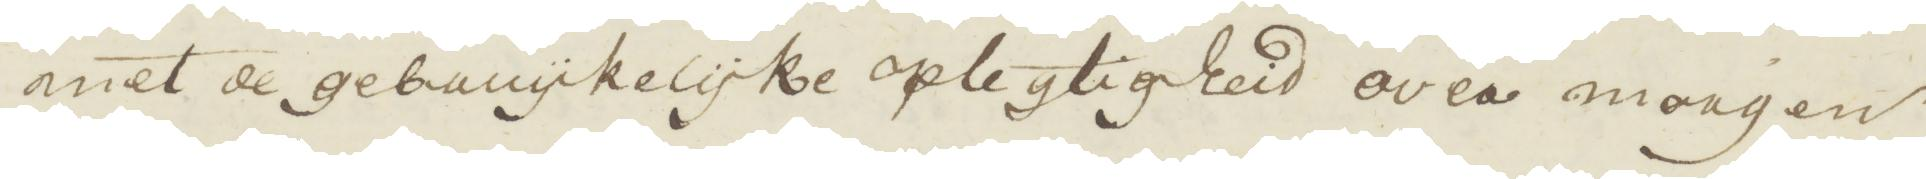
met de gebruijkelijke plegtigheid over morgen
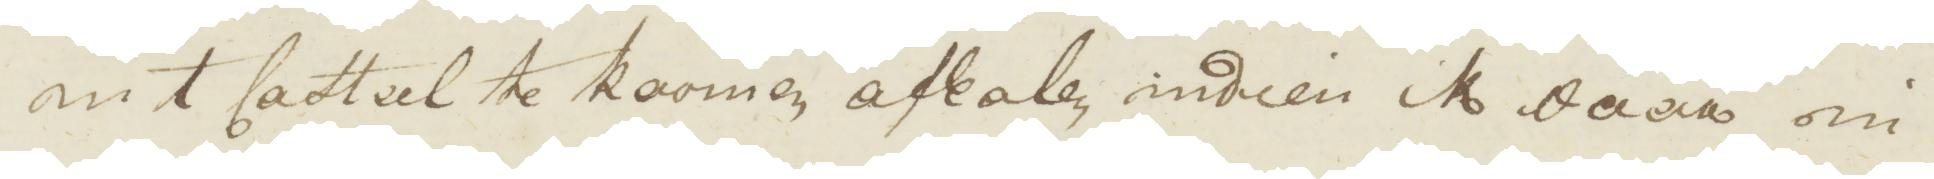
in ’t Casteel te koomen afhalen indien ik daar om
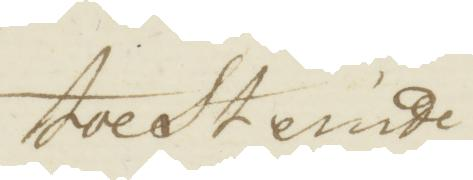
toestemde
